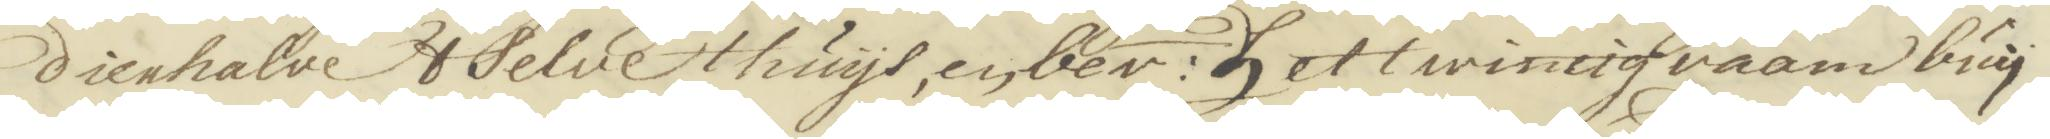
dierhalve 't selve thuijs en bev: het twintig vaam buij
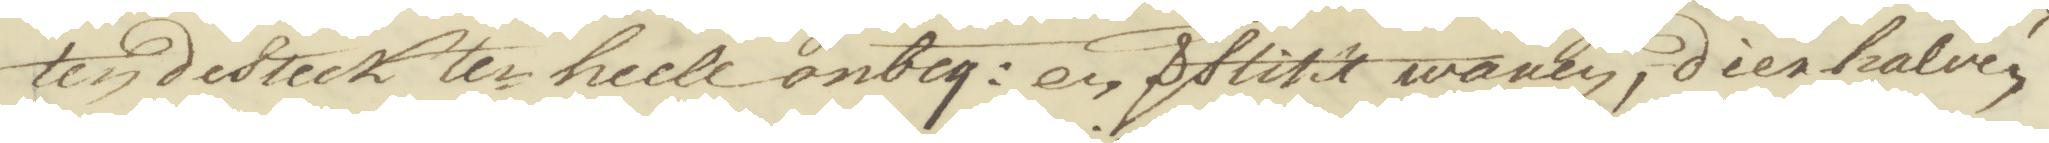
ten desteck ter heele onbeq: en verstikt waren, dier halven
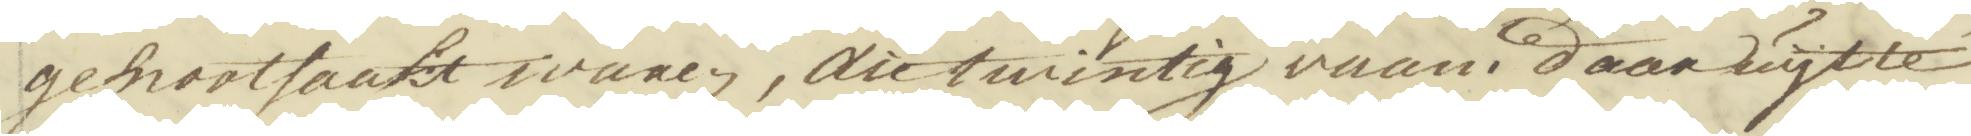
genootsaakt waren, die twintig vaam daar uijt te
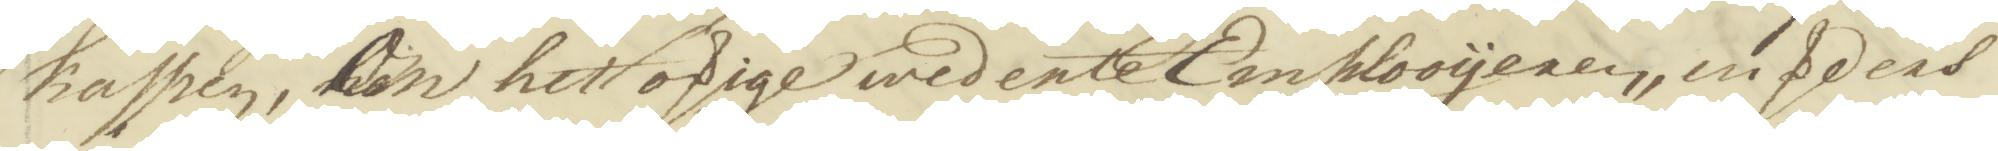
kappen, Om het overige weder te Emplooijeren, en verders
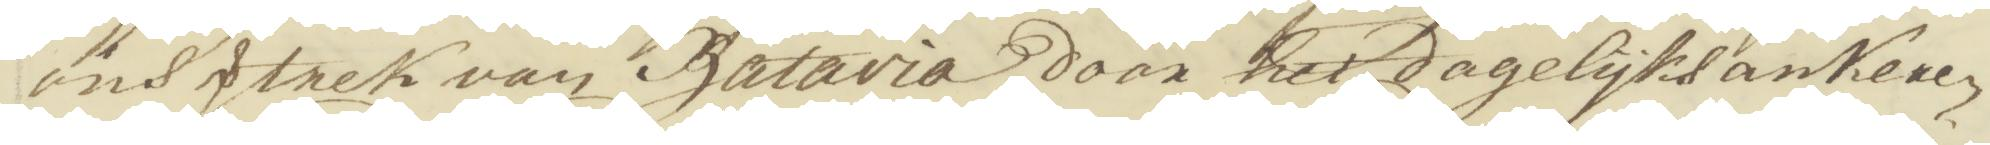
ons vertrek van Batavia, door het dagelijks ankeren
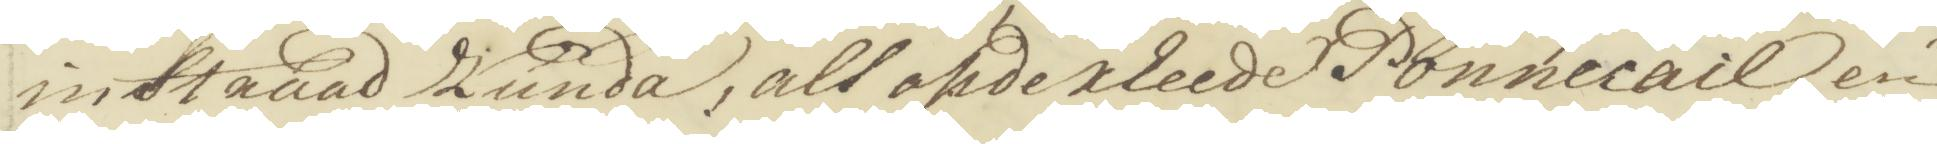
in straad Zunda, als onderheede Ponnecail, en
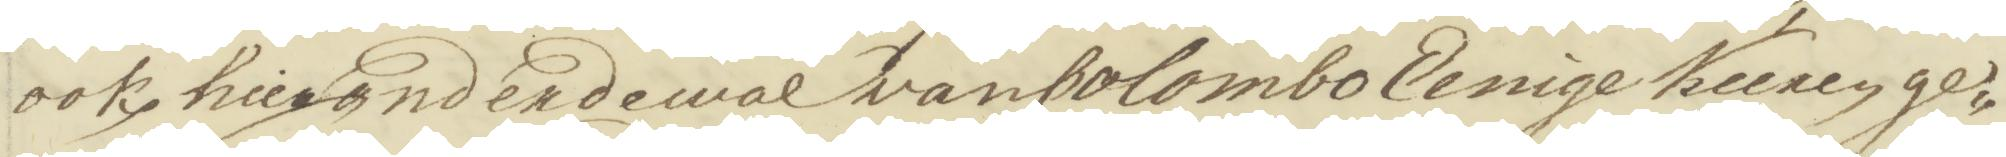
ook hier onder de wal van Colombo Eenige keeren ge„
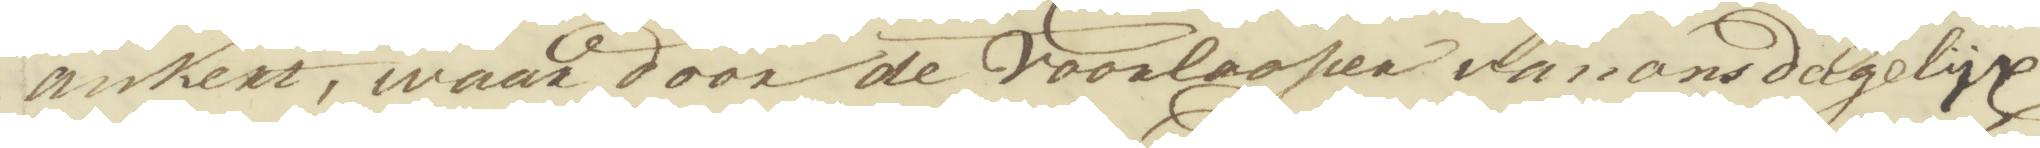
ankert, waar door de voorlooper van ons dagelijx
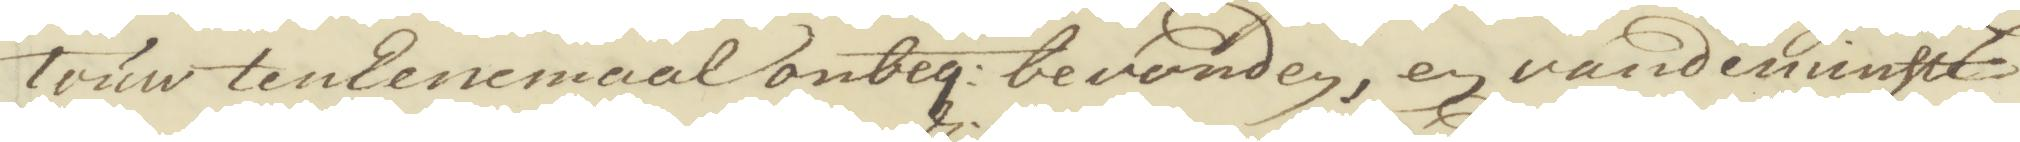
touw ten Eenemaal onbeq: bevonden, en vandeminste
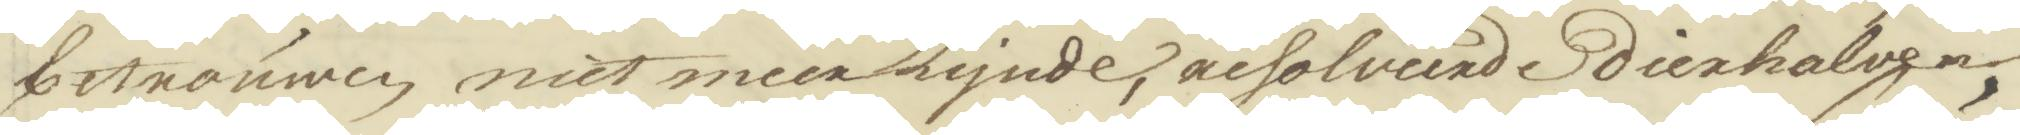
betrouwen niet meer zijnde, resolveerde dierhalven,
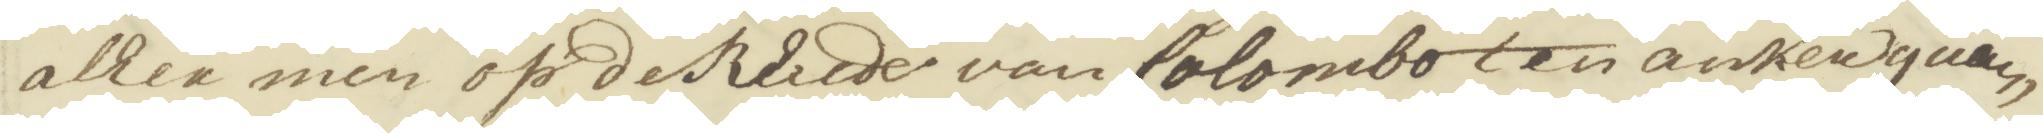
alher men op de Rhede van Colombo ten anker quam
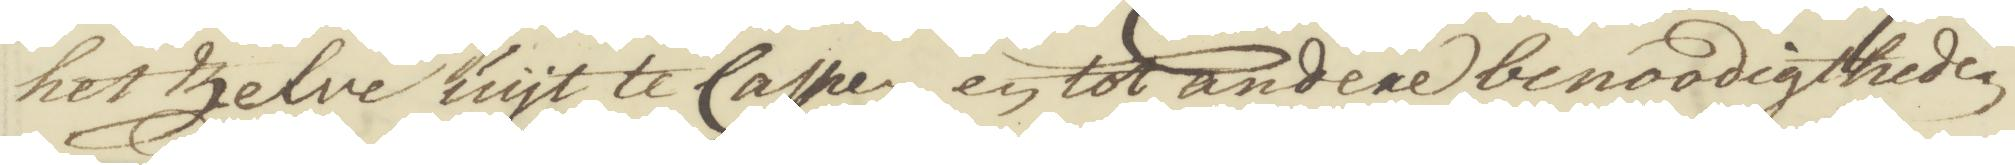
het zelve uijt te Cappen, en tot andere benoodigtheden
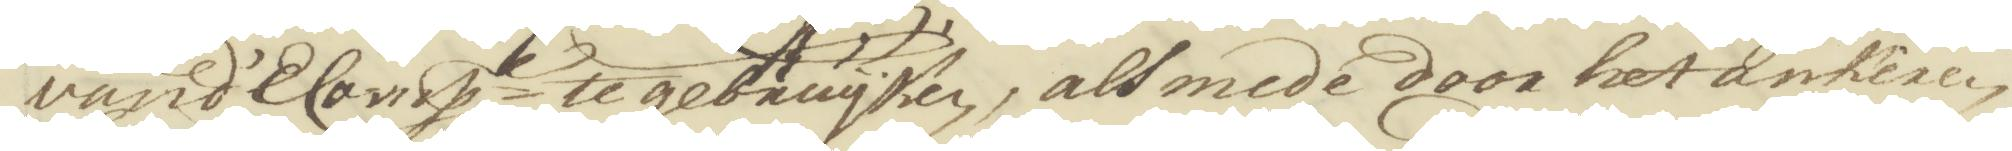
van d’ E Comp=e te gebruijken, als mede door het ankeren
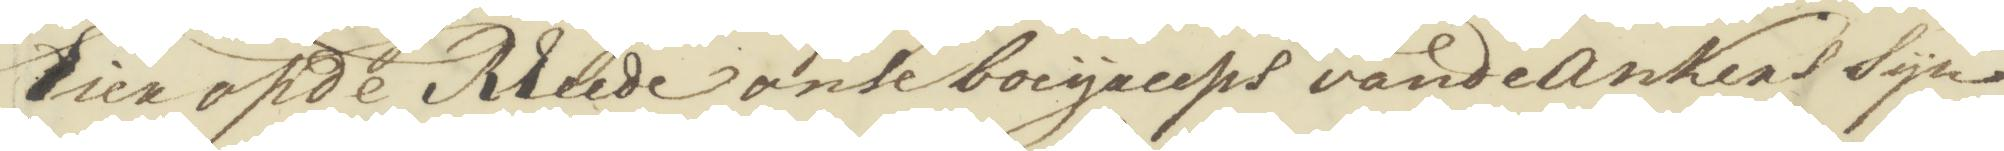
hier op de Rheede onse boeijreeps vande Ankers sijn
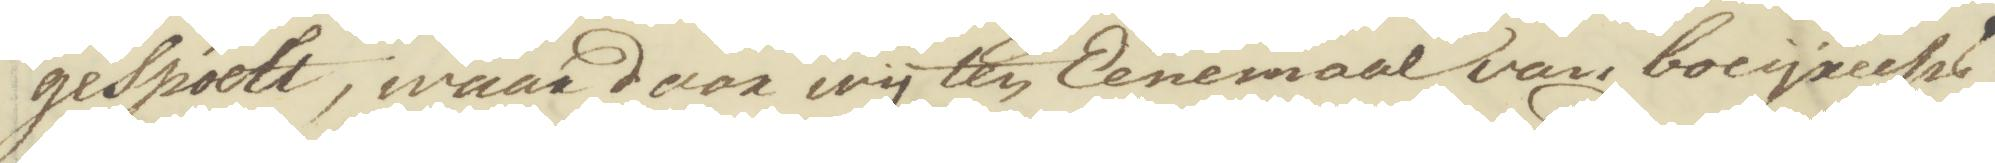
gespoelt, waar door wij ten Eenemaal van boeijreeps
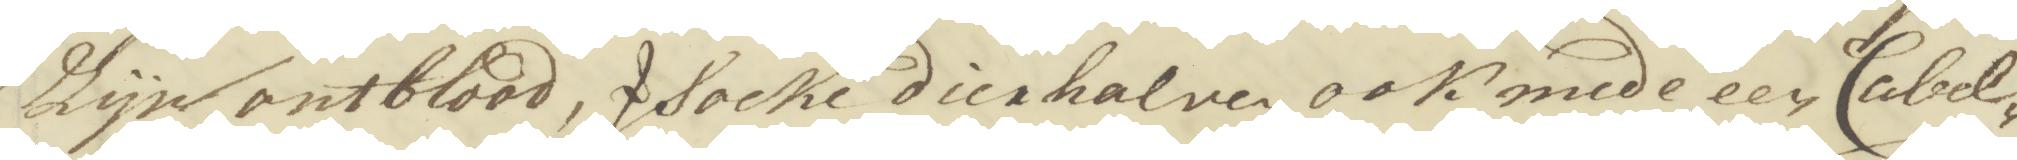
zijn ontblood, versoeke dierhalven ook mede een Cabel„
